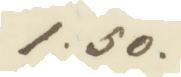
1. 50.
